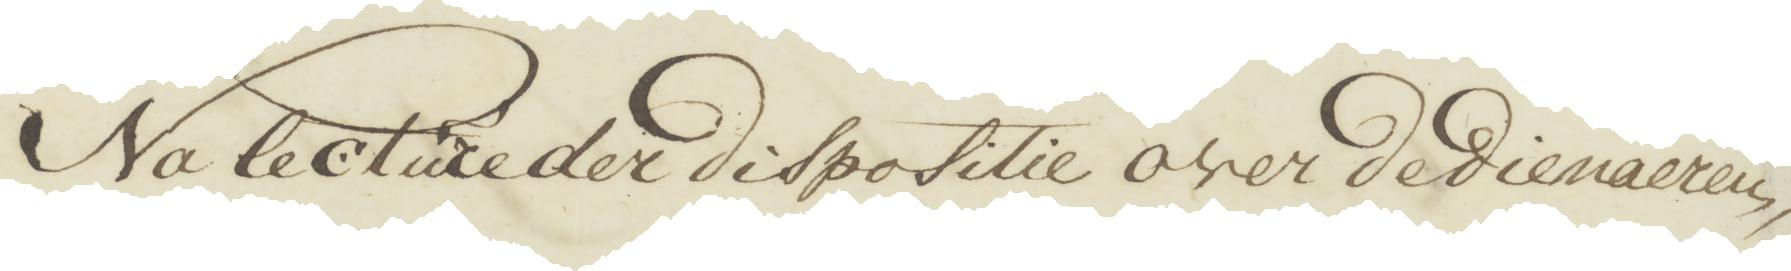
Na lecture der dispositie over dedienaeren
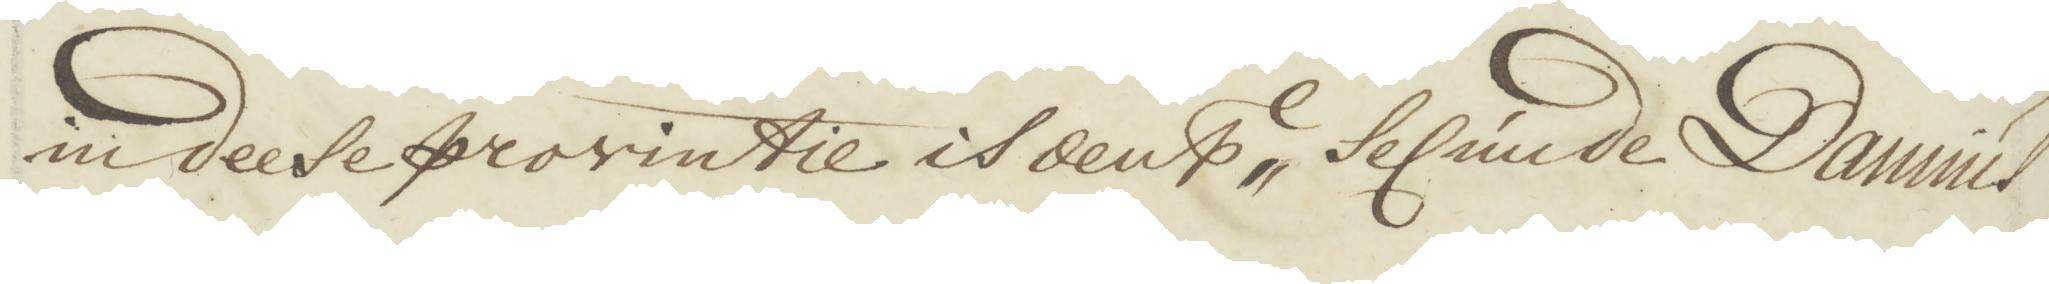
in deese provintie is den p„l secunde Damius
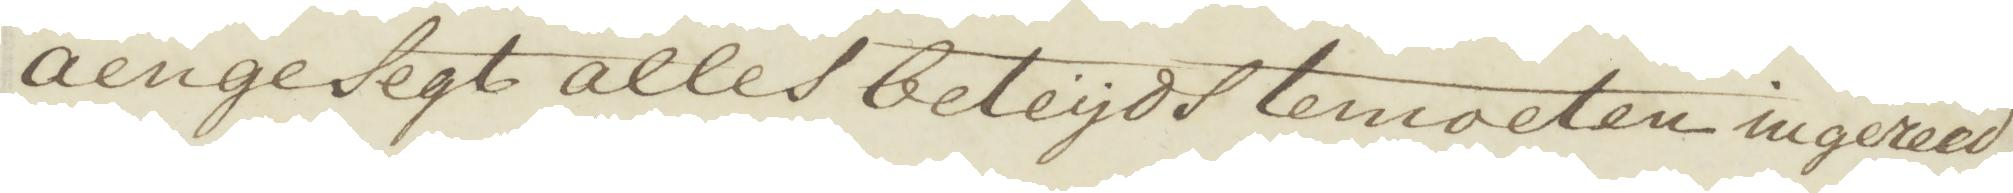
aengesegt alles beteijds temoeten ingereed
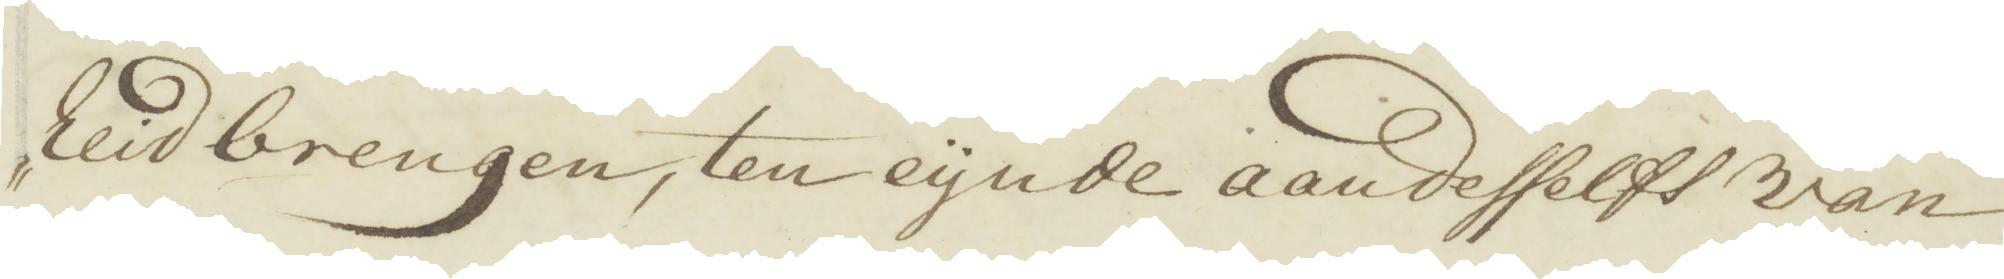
„heid brengen, ten eijnde aan desselfs van
